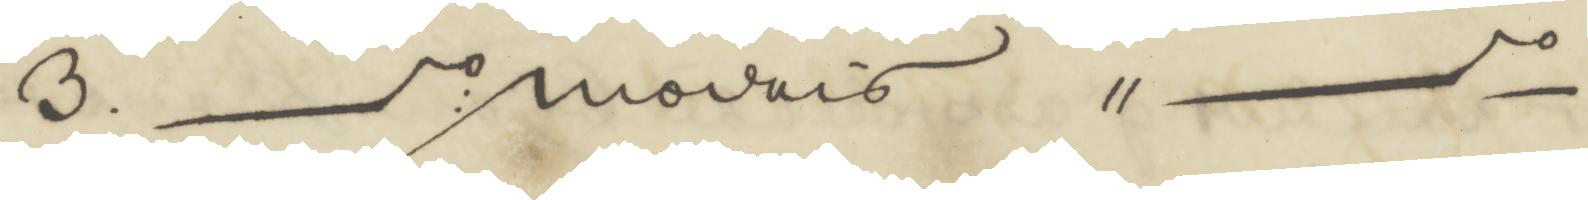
3. D:o moeris „ D-o
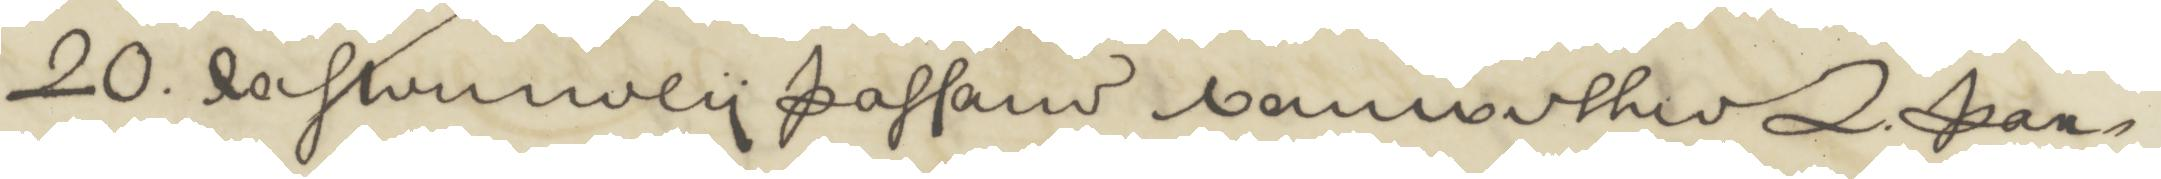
20. lasten nelij passane van welke 2. par
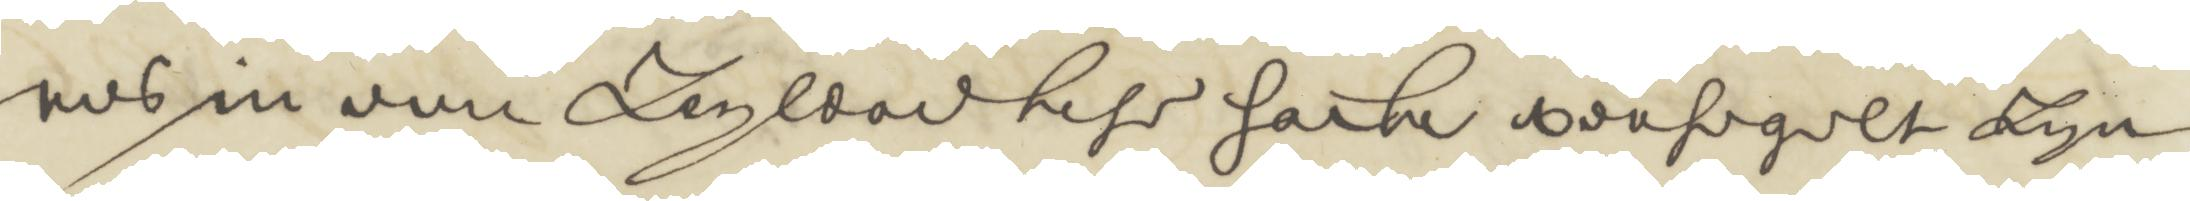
res in een Zeyldoekse sack versegelt zyn
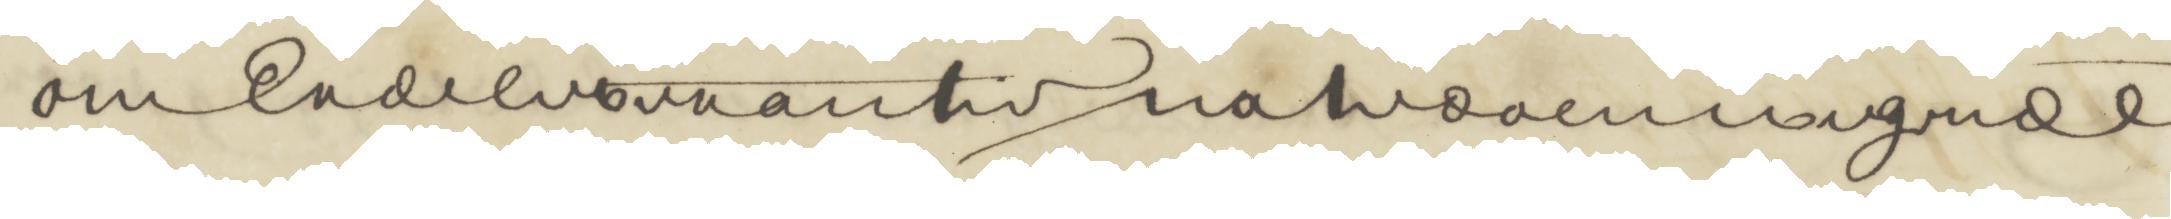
om Erdeleverantie na te doen wegende
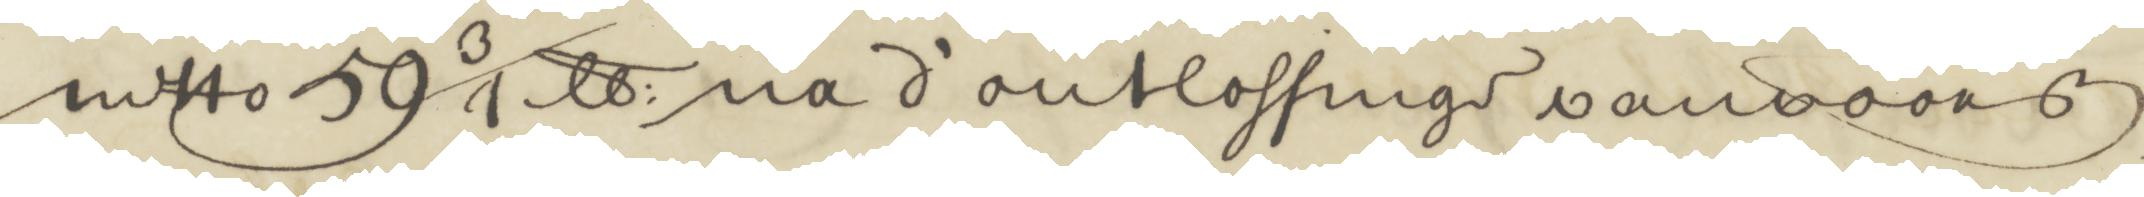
netto 59¾ lb: na d’ontlossinge van voors
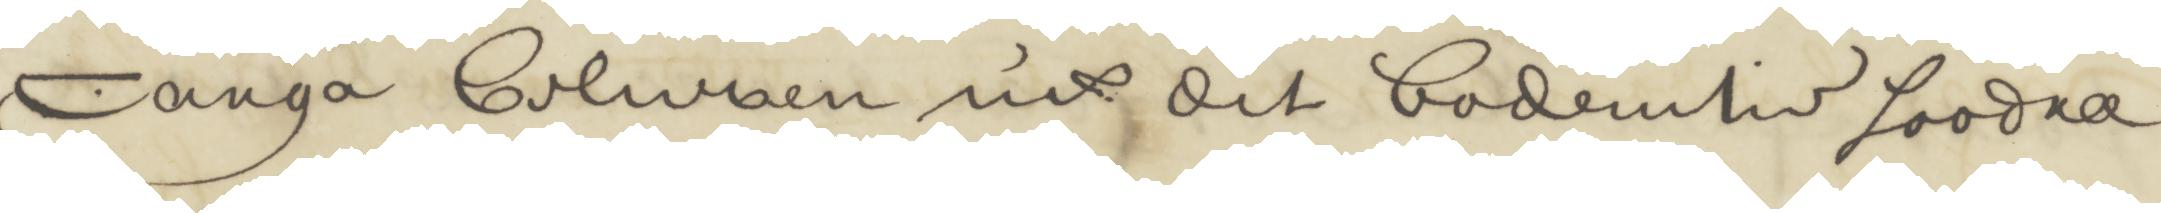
Cargo believen uE: dit bodemtie soodra
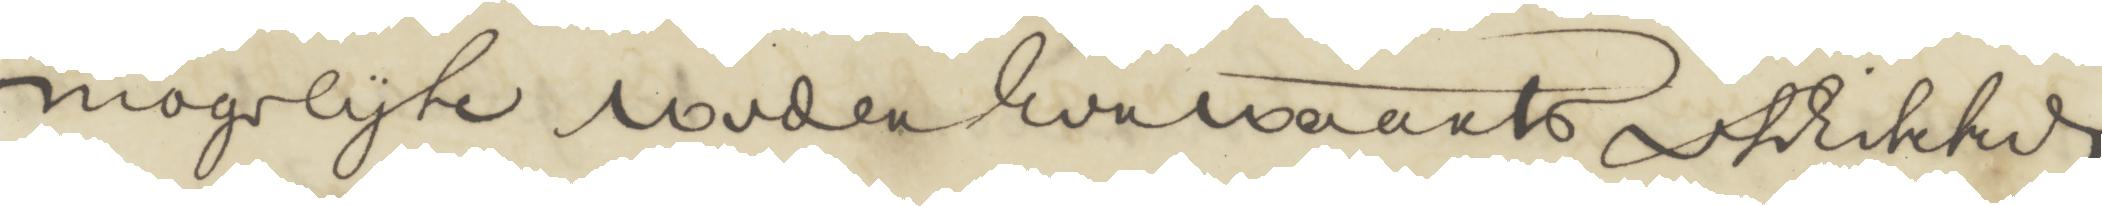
mogelijk weder herwaarts verschikken
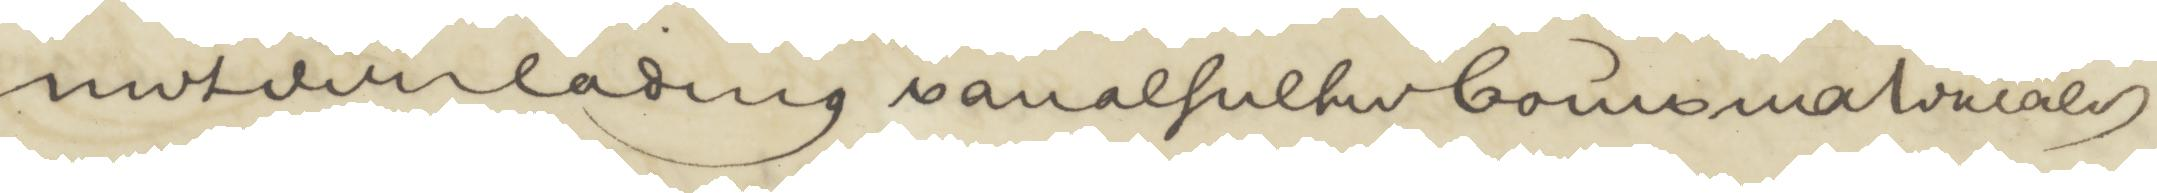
met een lading van alsulke bouwmaterialen
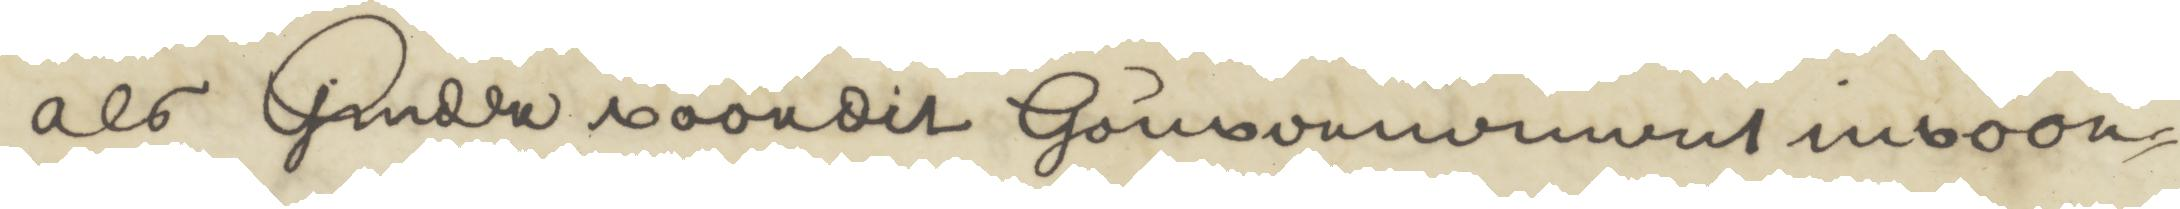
als Ginder voordit Gouvernement in voor„
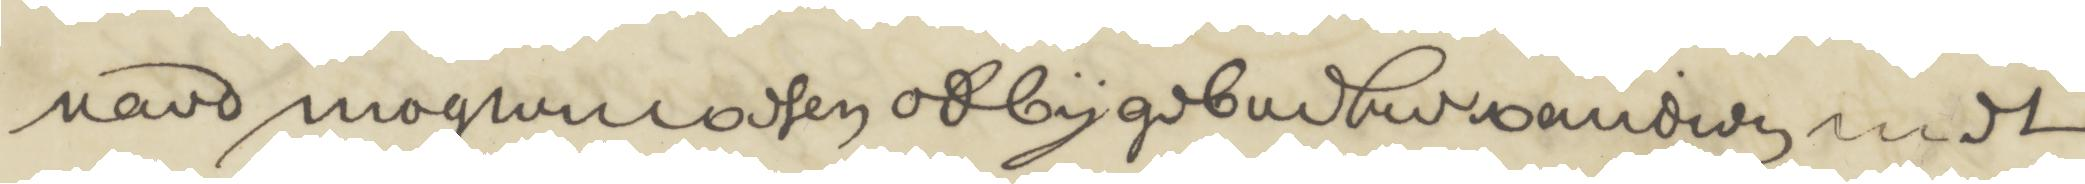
raed mogten wesen of bij gebreke vandien met
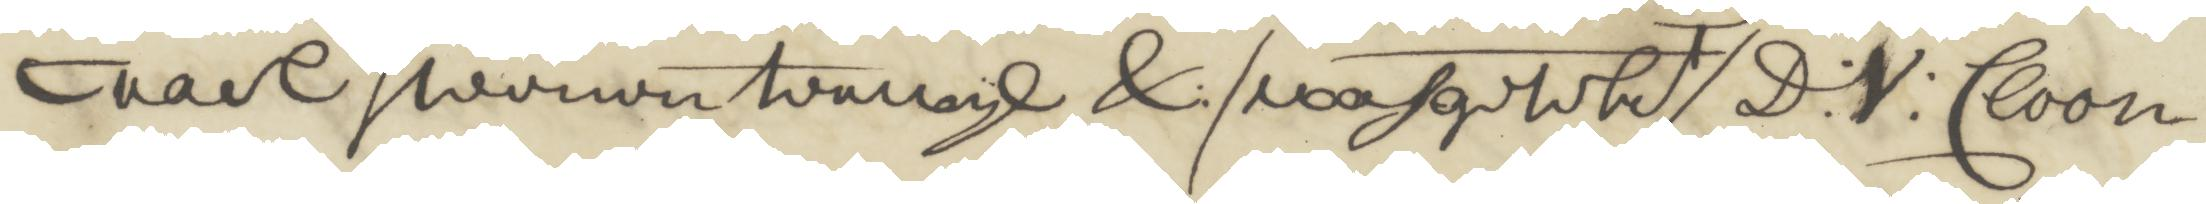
crael steenen terwijl &: / was getekt / D: V: Cloon
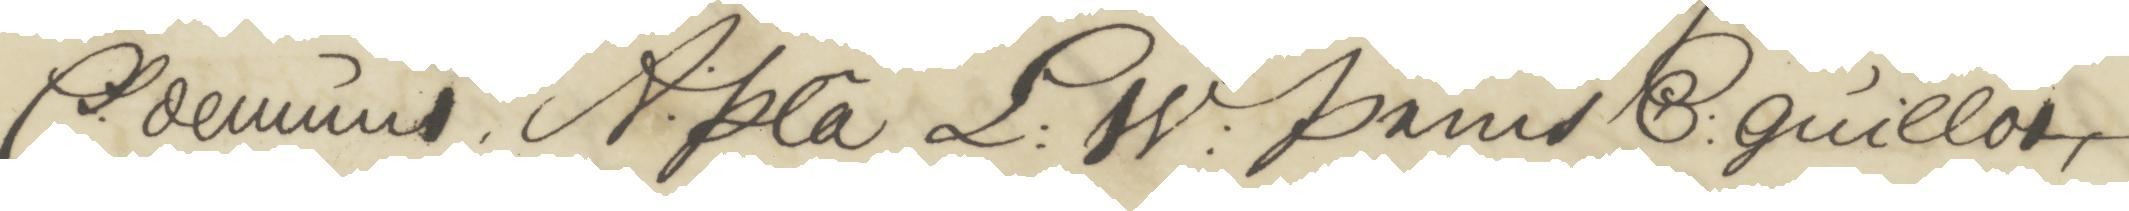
C:s demunt, A:plâ L: W: Prins E: Guillot,
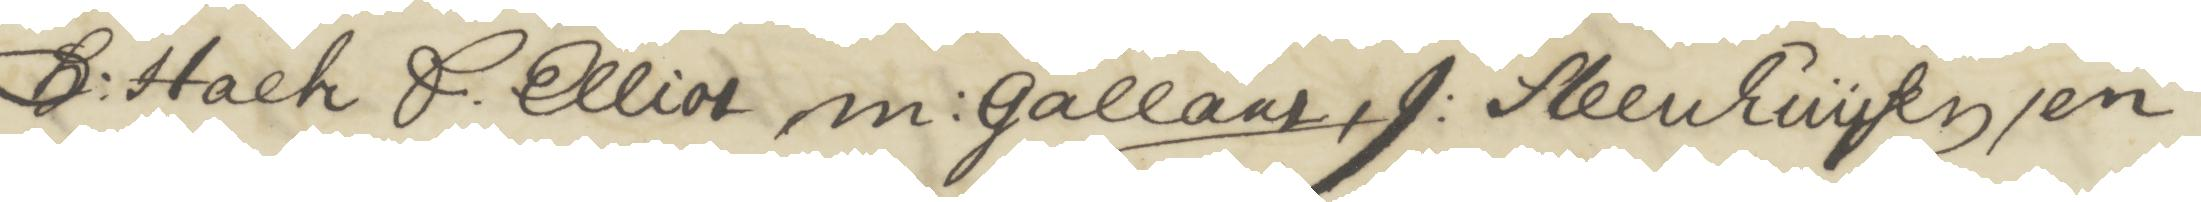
H: Haek F: Elliot, m: gallart, J: Steenhuijsen, en
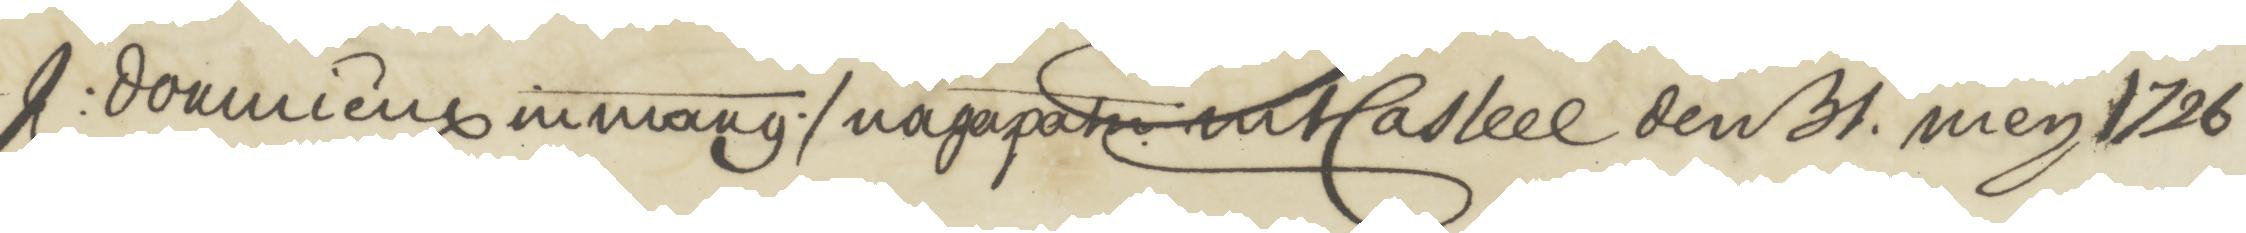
J: dormieur in marg :/ nagapatn: int Casteel den 31.' mey 1726
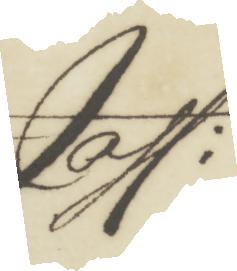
Jaff:
